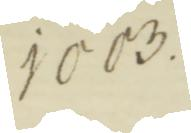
1003.
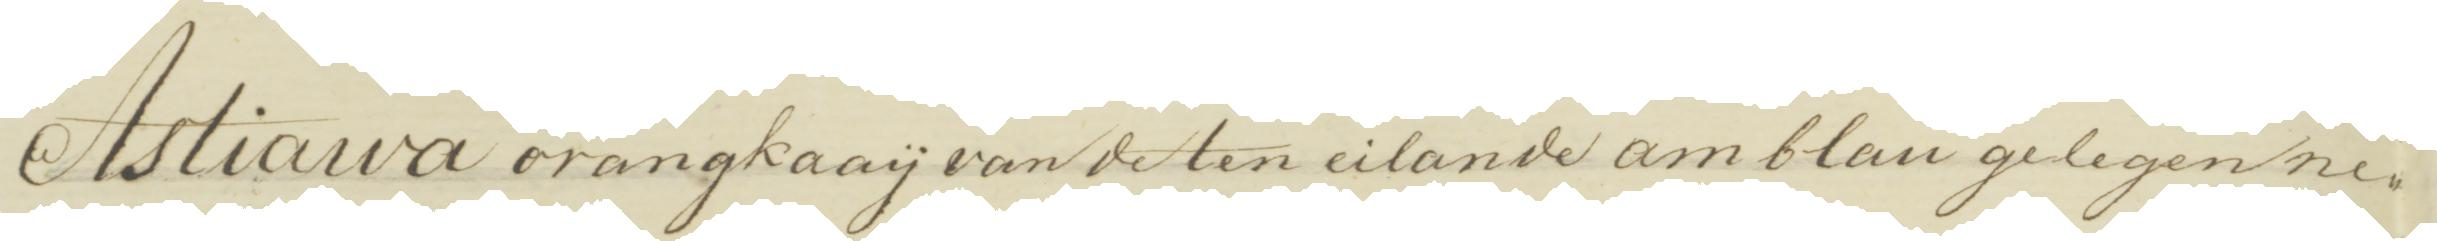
Astiawa orangkaaij van de ten eilande amblau gelegen ne„
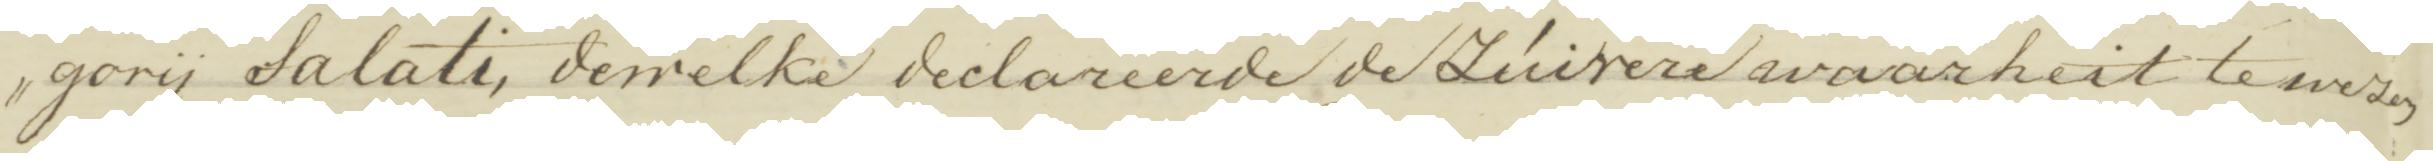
„gorij Salati, dewelke declareerde de Zuivere waarheit te wezen
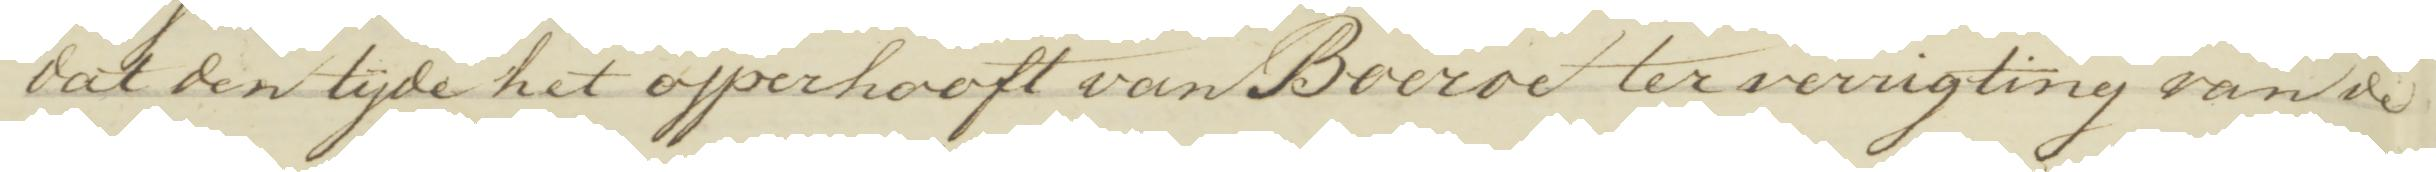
dat den tijde het opperhooft van Boeroe ter verrigting van de
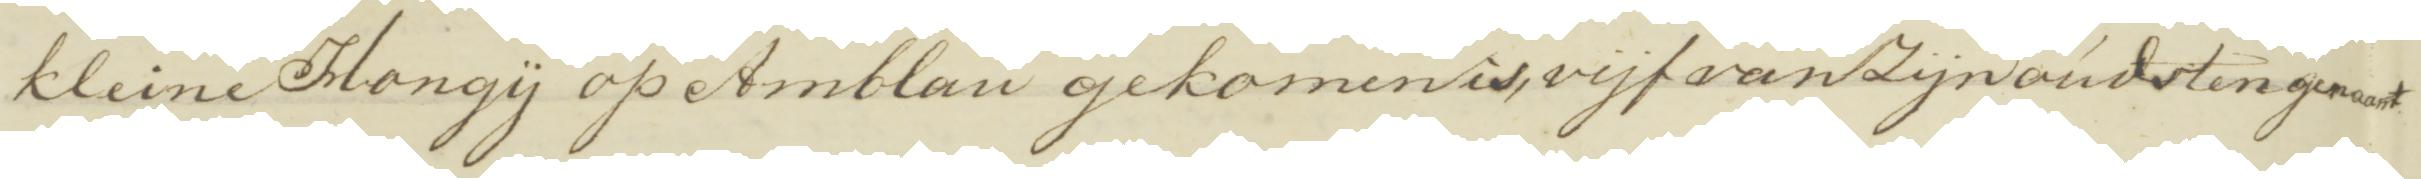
kleine Hongij op Amblau gekomen is, vijf van Zijn oudsten genaant
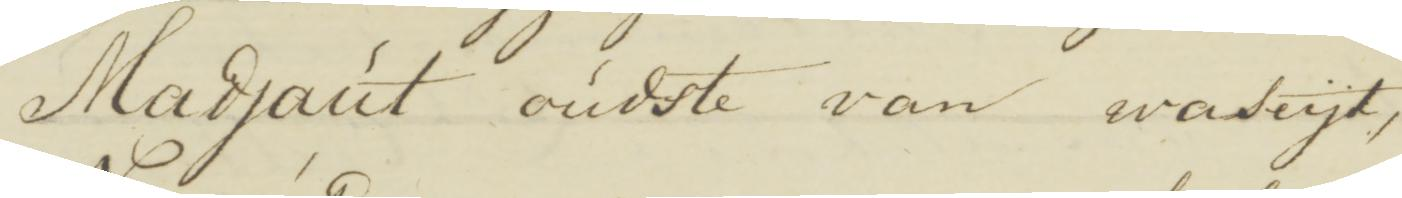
Madjaut oudste van waseijt,
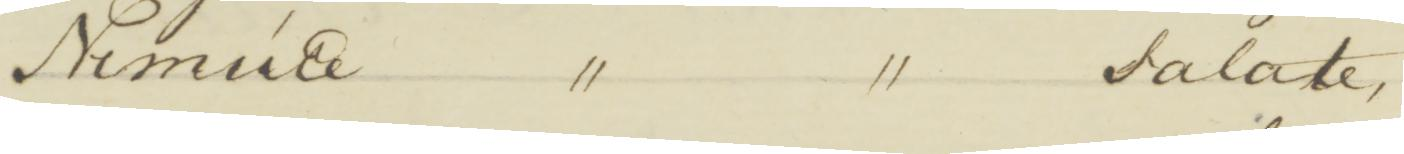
Nemude „ „ Salate,
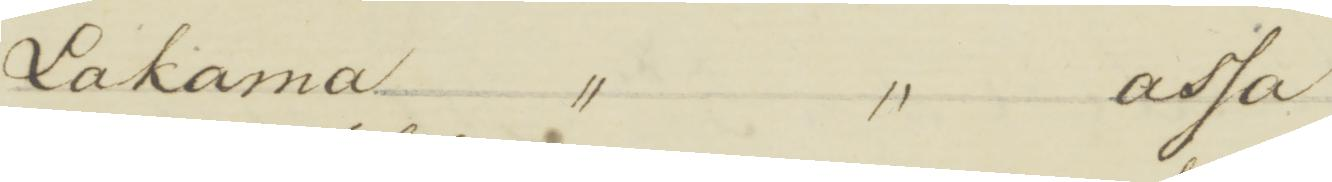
Lakama „ „ assa
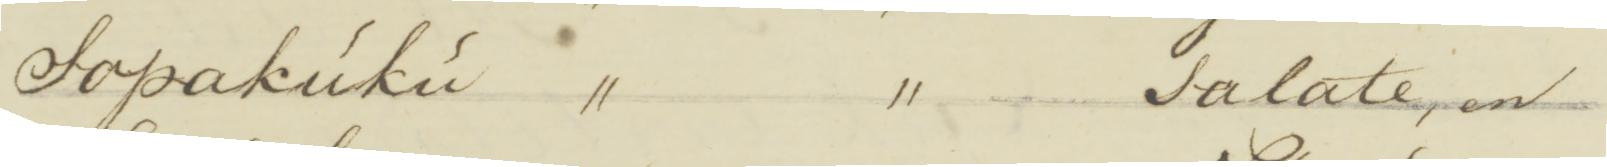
Sopakuku „ „ Salate, en
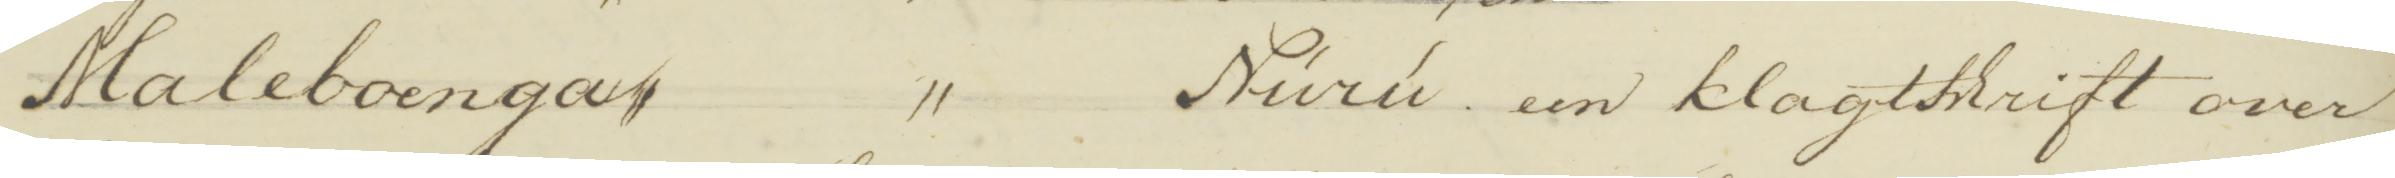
Maleboenga„ „ Nuru, een klagtschrift over
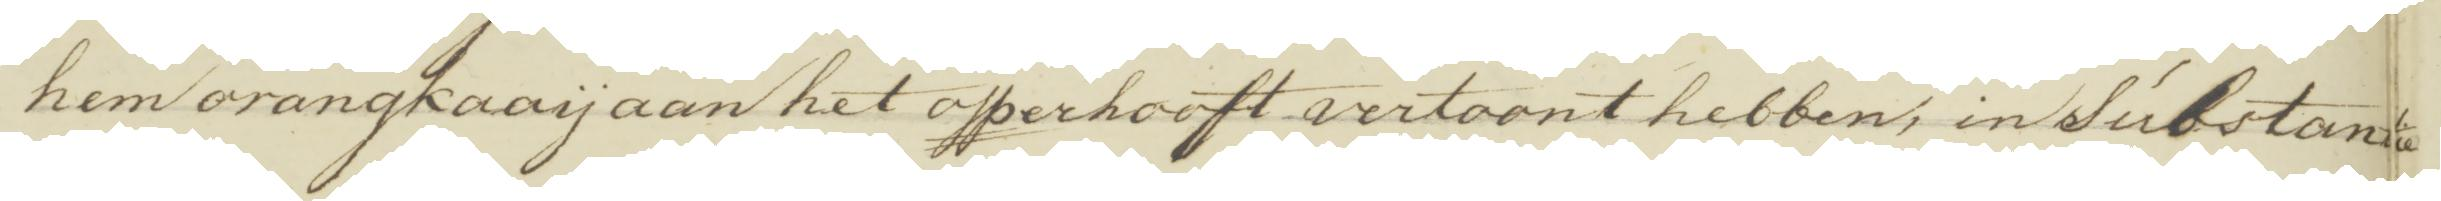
hem orangkaaij aan het opperhooft vertoont hebben, in Substantie
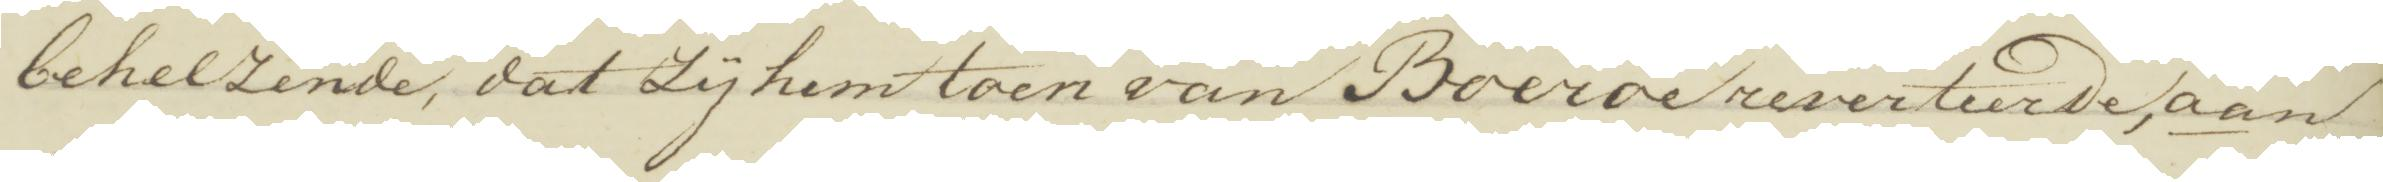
behelzende, dat zij hem toen van Boeroe reverteerde, aan
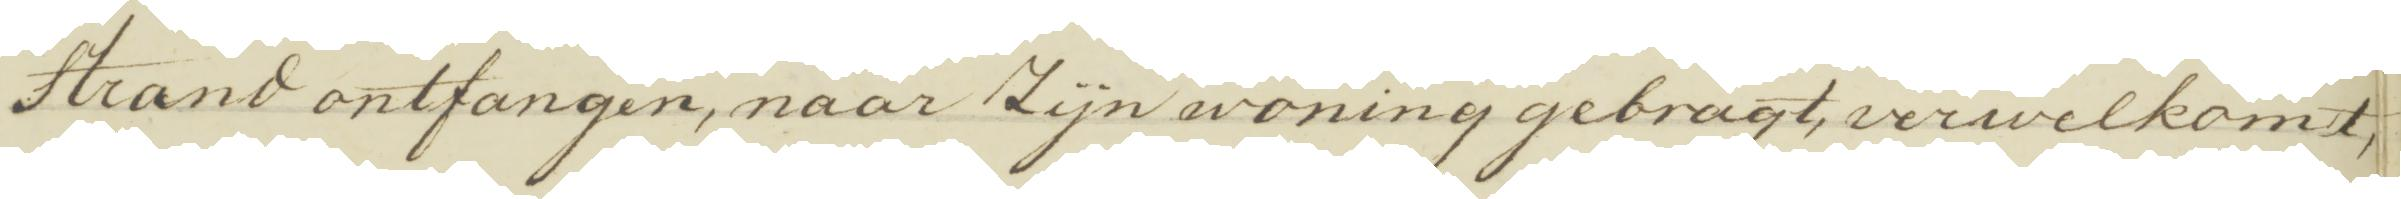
Strand ontfangen, naar Zijn woning gebragt, verwelkomt,
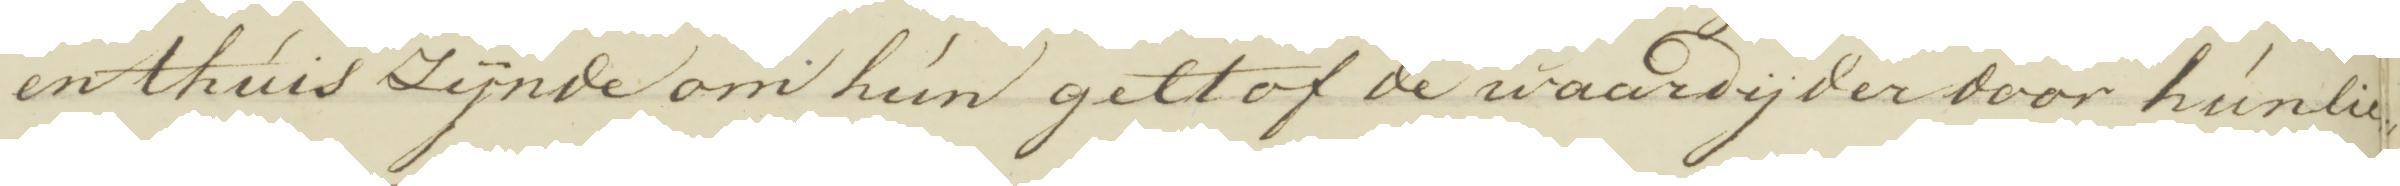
en thuis Zijnde om hun gelt of de waardij der door hun lie„
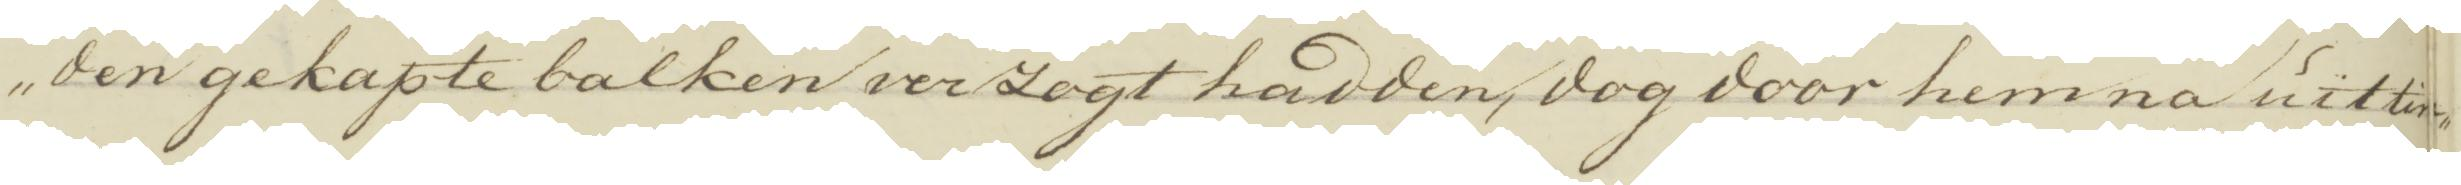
„den gekapte balken verzogt hadden, dog door hem na uit tin„
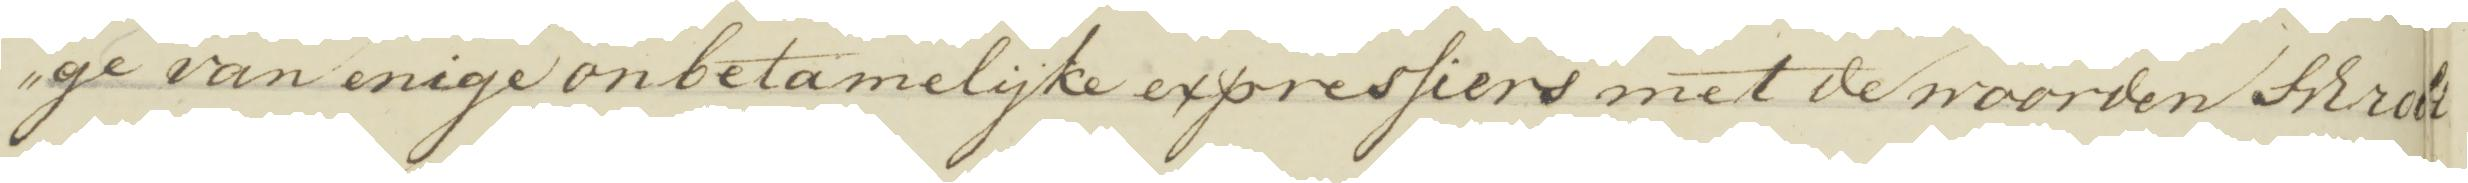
„ge van enige onbetamelijke expressiers met de woorden schrobt
